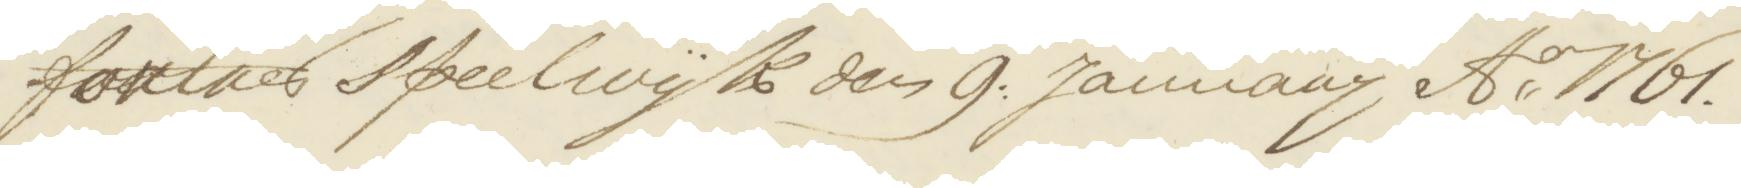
fortres speelwijk den 9: Januarij A„o 1761.
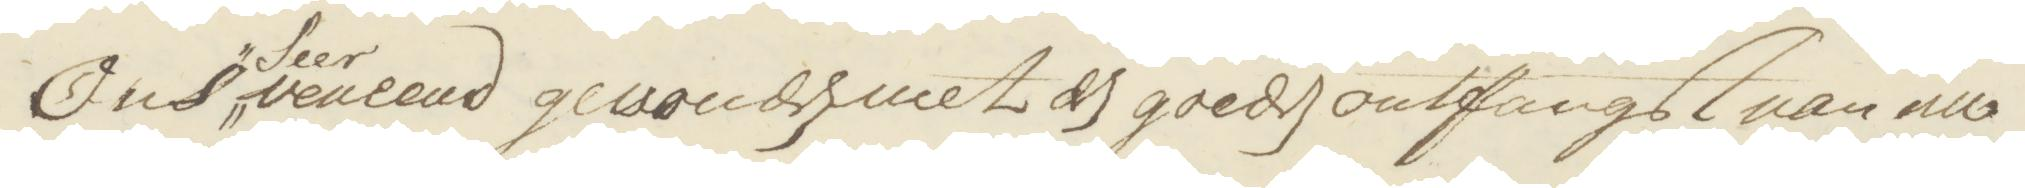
Ons „seer vereerd gevonden met den goeden ontfangst van uw
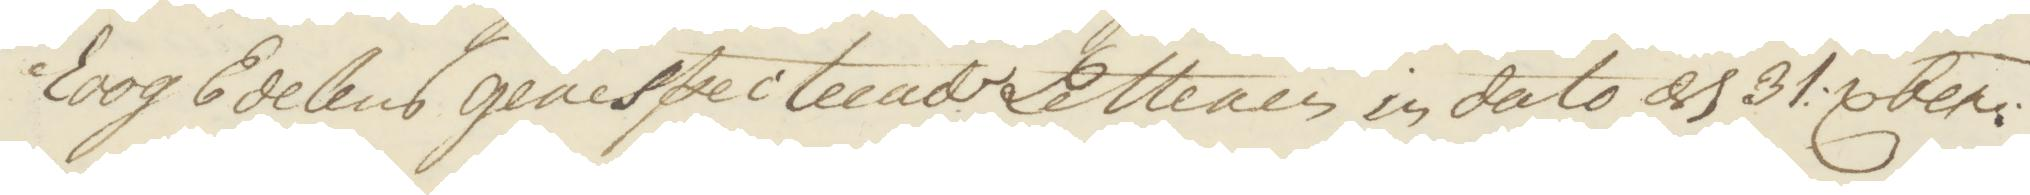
hoog Edelens gerespecteerde letteren in dato den 31: xber:
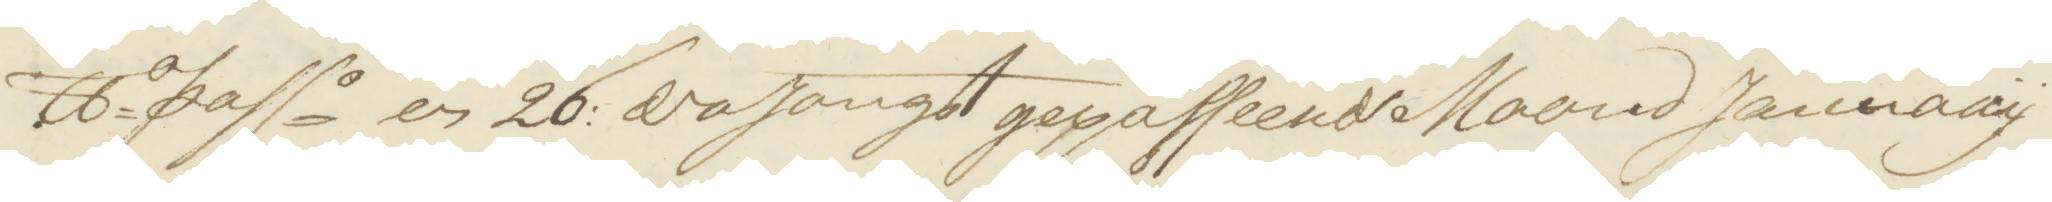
A=o pass=o en 26: der jongst gepasseerde Maand Januarij
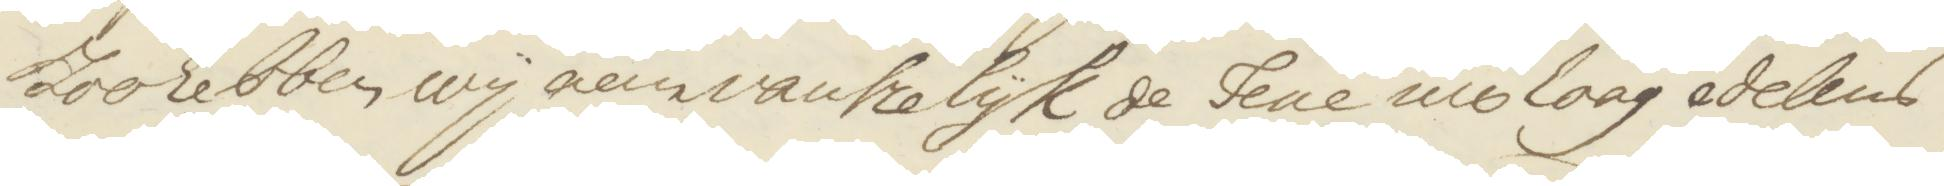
zoo hebben wij aanvankelijk de Eere uw hoog edelens
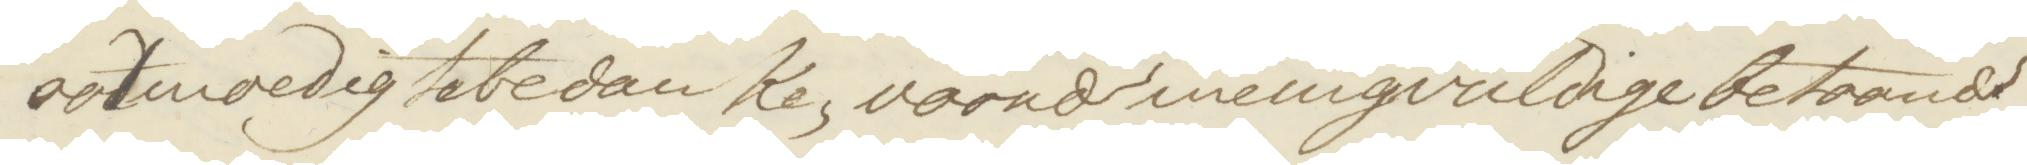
ootmoedig te bedanken voor de menigvuldige betoonde
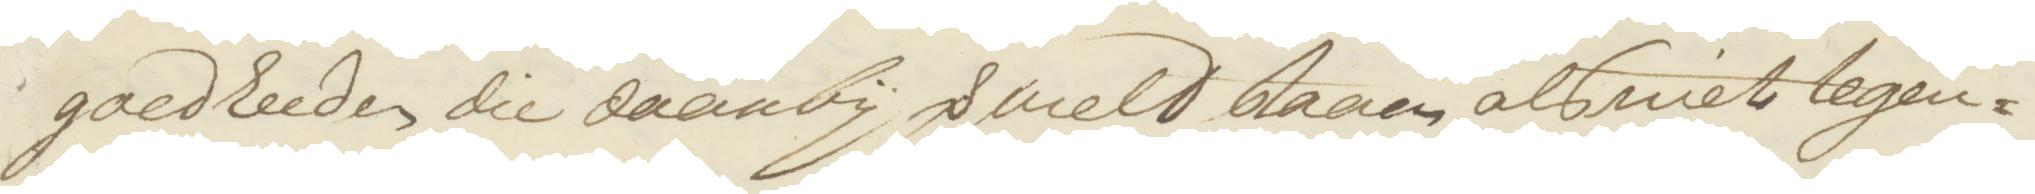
goedheeden die daarbij vermeld staan als niet tegen=
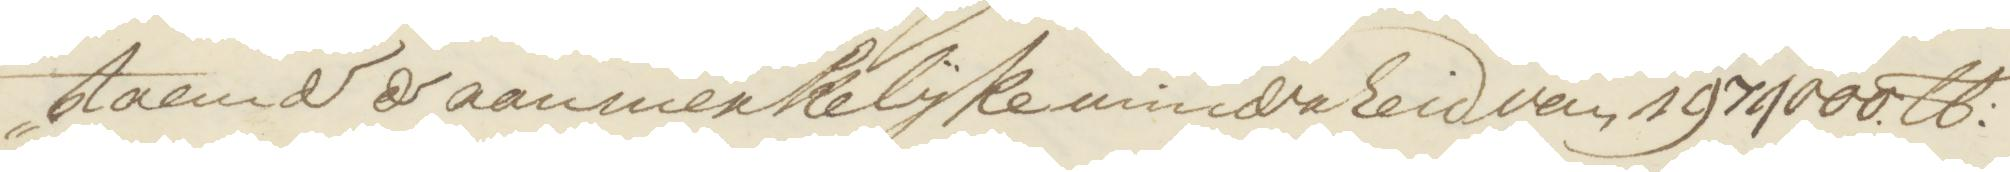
„staande de aanmerkelijke minderheid van 1974000: lb:
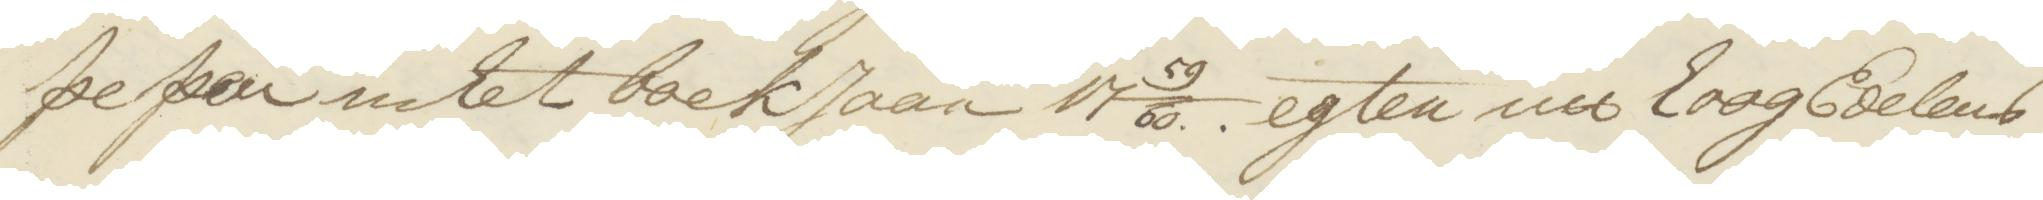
peper in het boekjaar 17 59/60. egter uw hoog Edelens
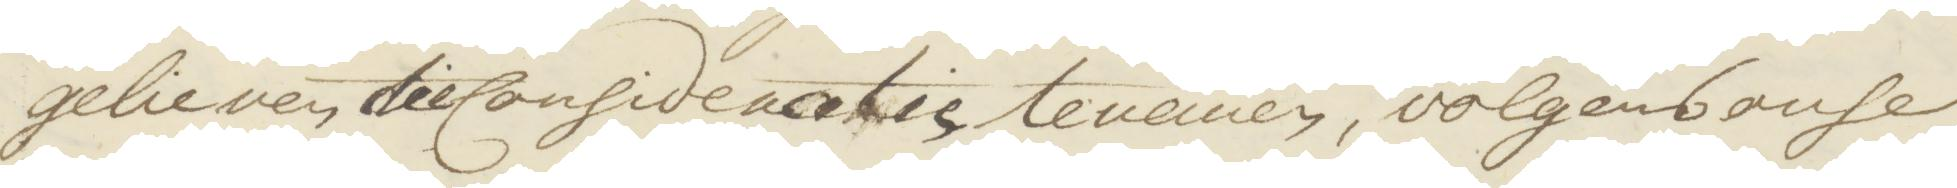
gelieven die consideratie te nemen, volgens onse
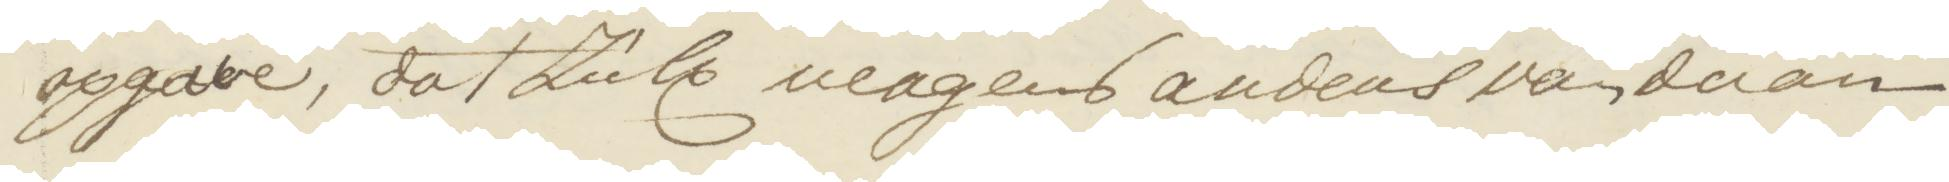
opgave, dat zulx nergens anders vandaan
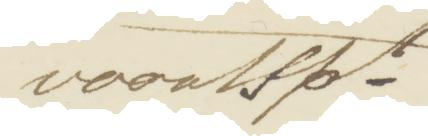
voortsp-t
